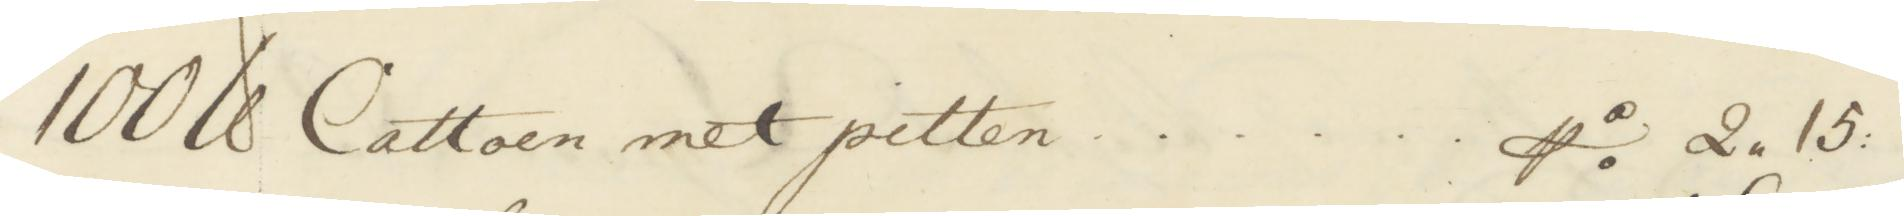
100 lb Cattoen met pitten . . . . . . pa/o 2„ 15:
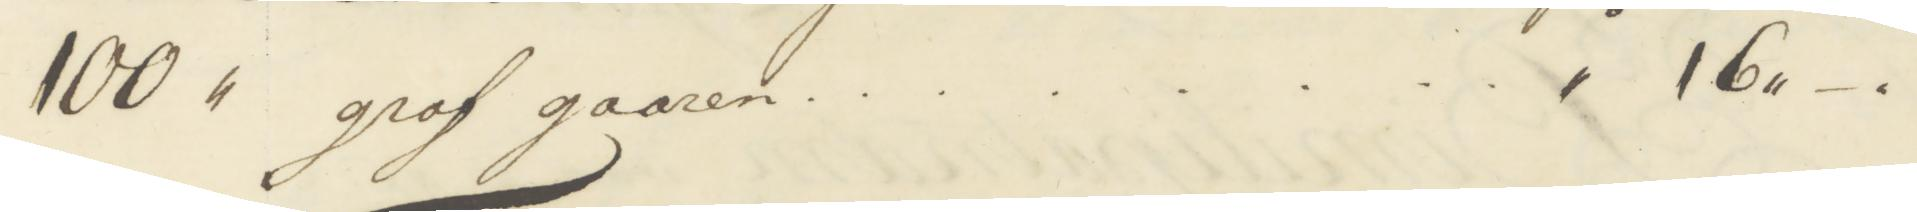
100 „ grof gaaren . . . . . . . . „ 16„ — .
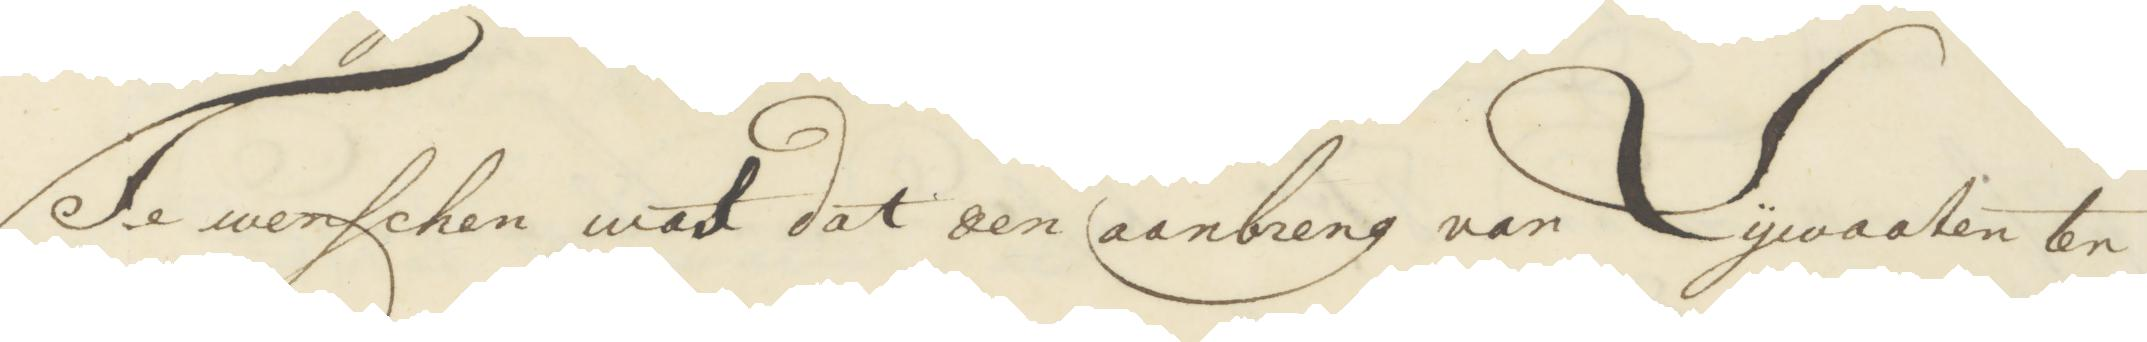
Te wenschen was dat den aanbreng van Lijwaaten ten
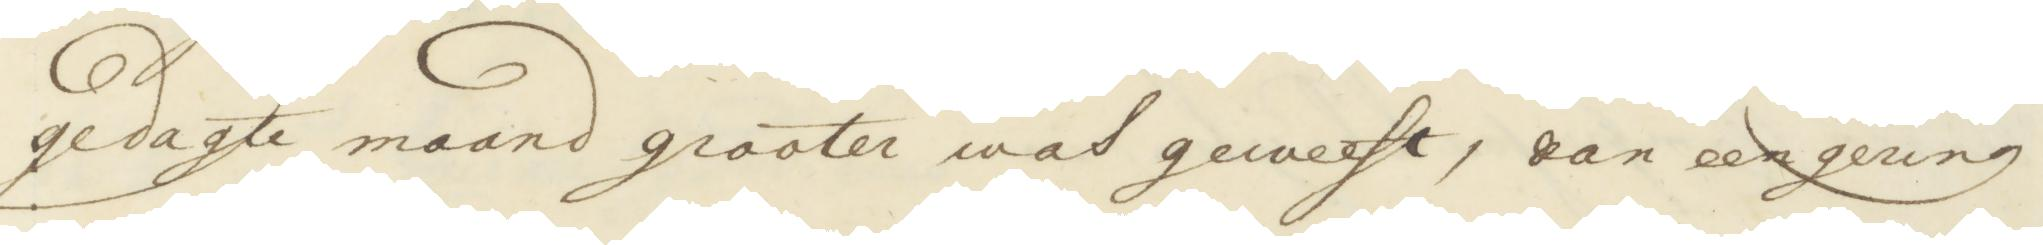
gedagte maand grooter was geweest, dan een gering
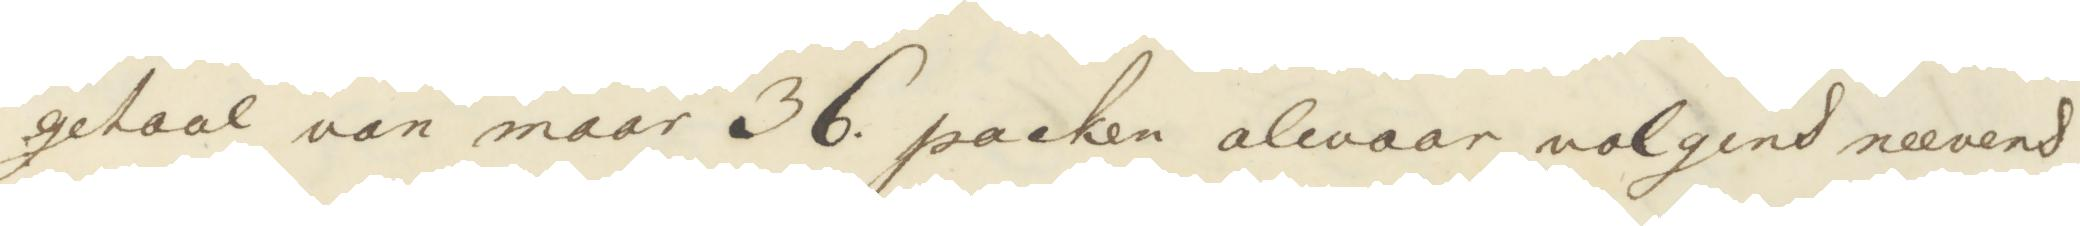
getaal van maar 36. packen alwaar volgens neevens
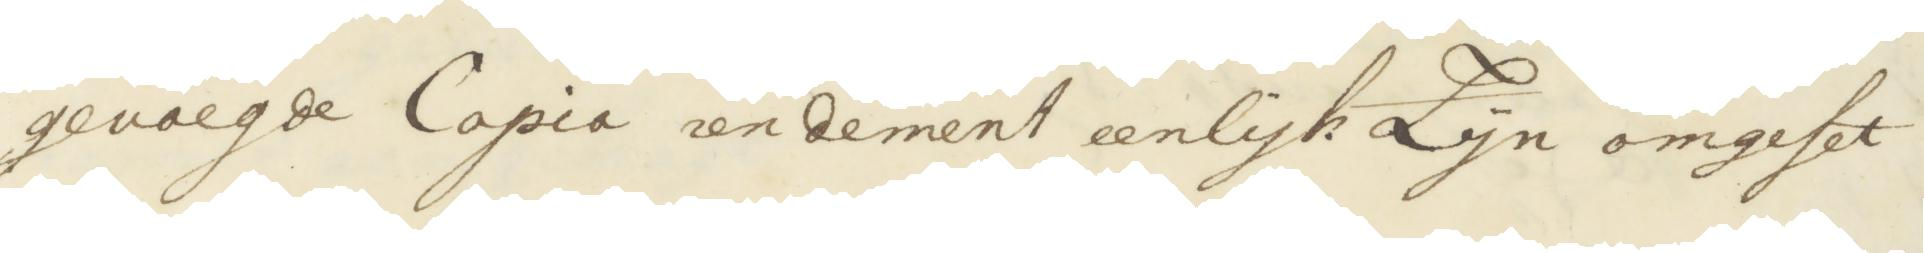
gevoegde Copia rendement eenlijk zijn omgeset
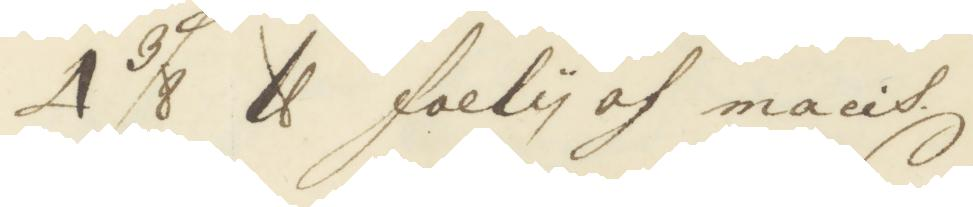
4 3/8 lb foelij of macis.
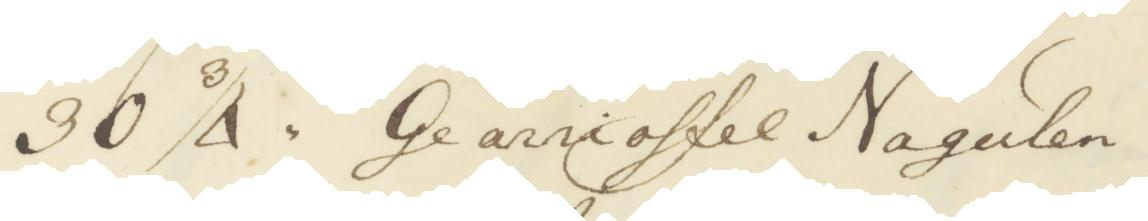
30¾ „ Gearrioffel Nagulen
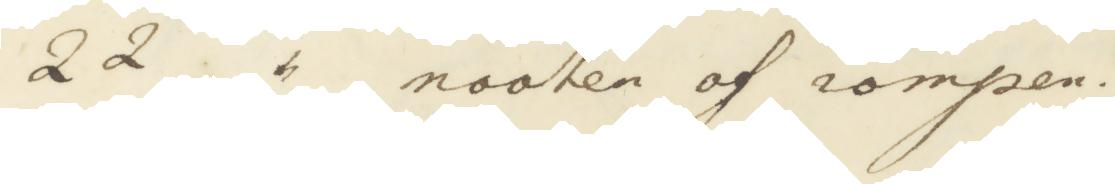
22 „ nooten of rompen
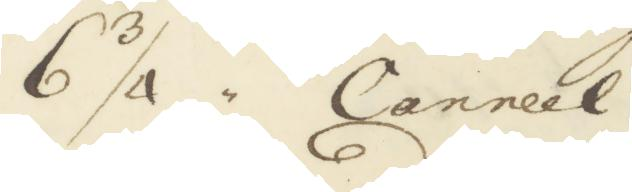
6¾ „ Canneel
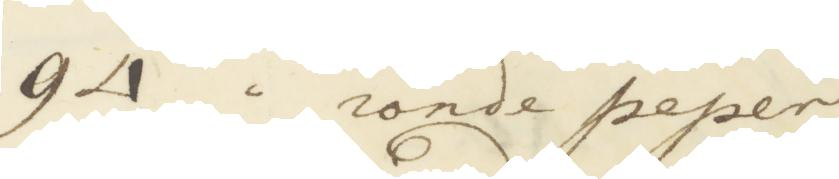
94 „ ronde peper
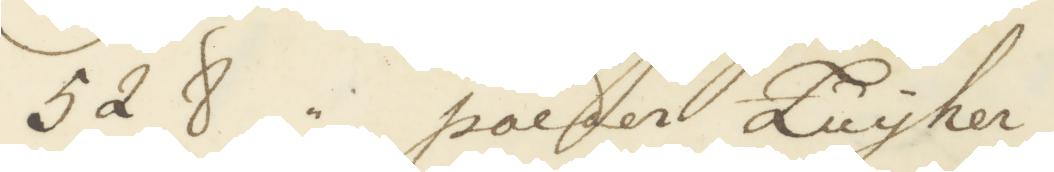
528 „ poeder Zuijker
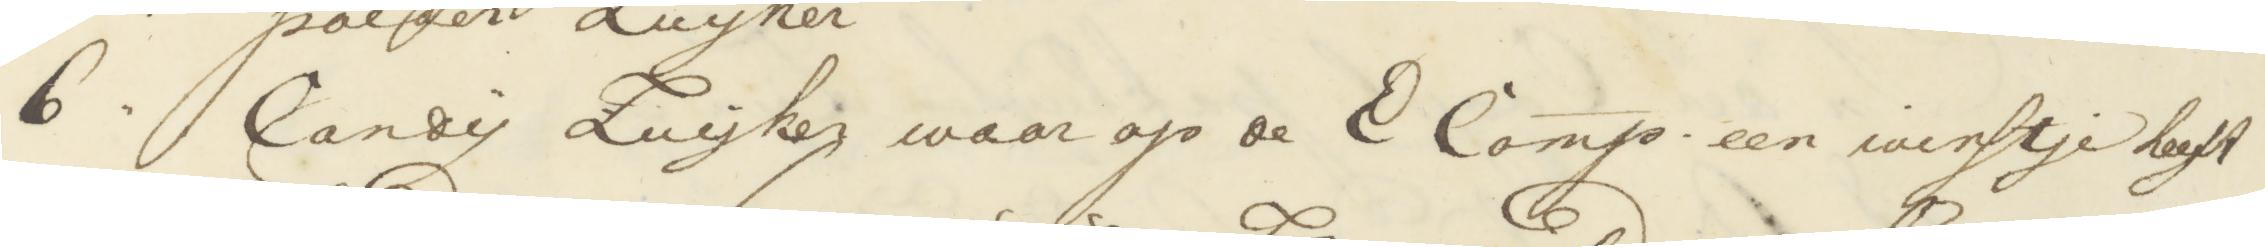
6 „ Candij Zuijken waar op de E Comp. een winstje heeft
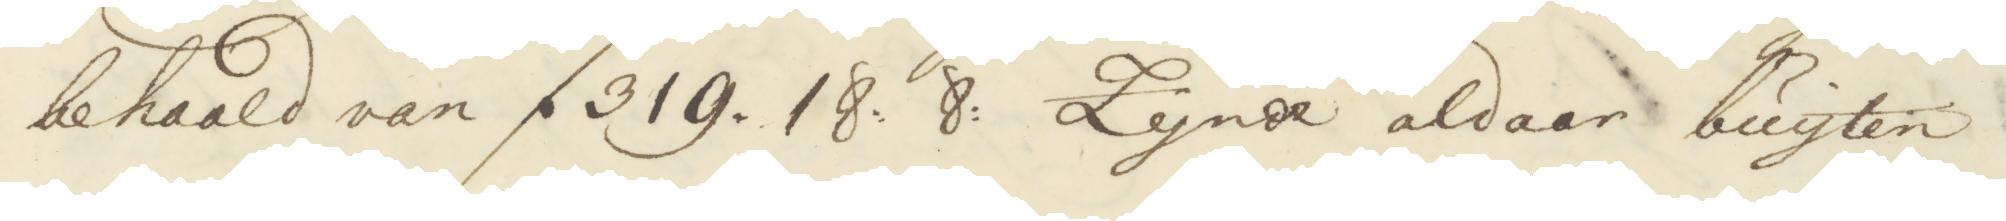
behaald van ƒ319. 18: 8: Zijnde aldaar buijten
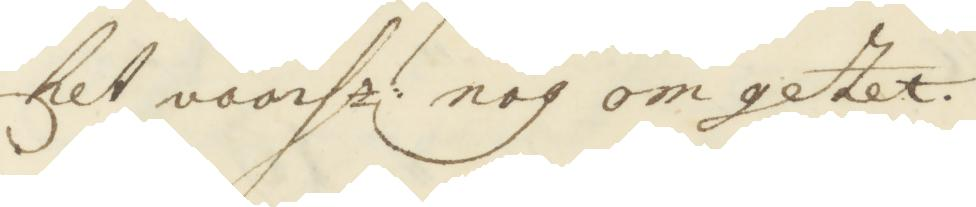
het voorsz: nog om gezet.
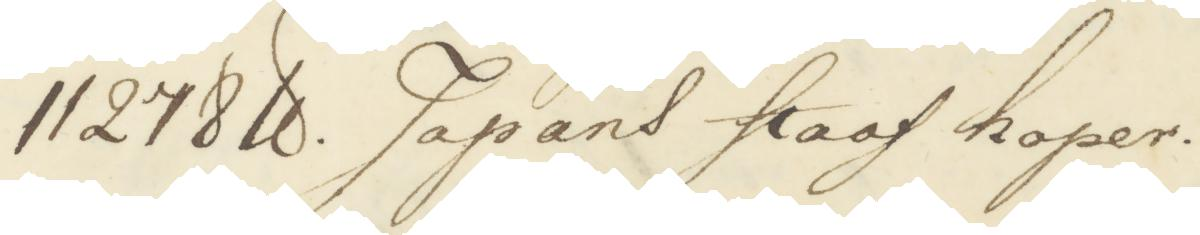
11278 lb. Japans staaf koper.
